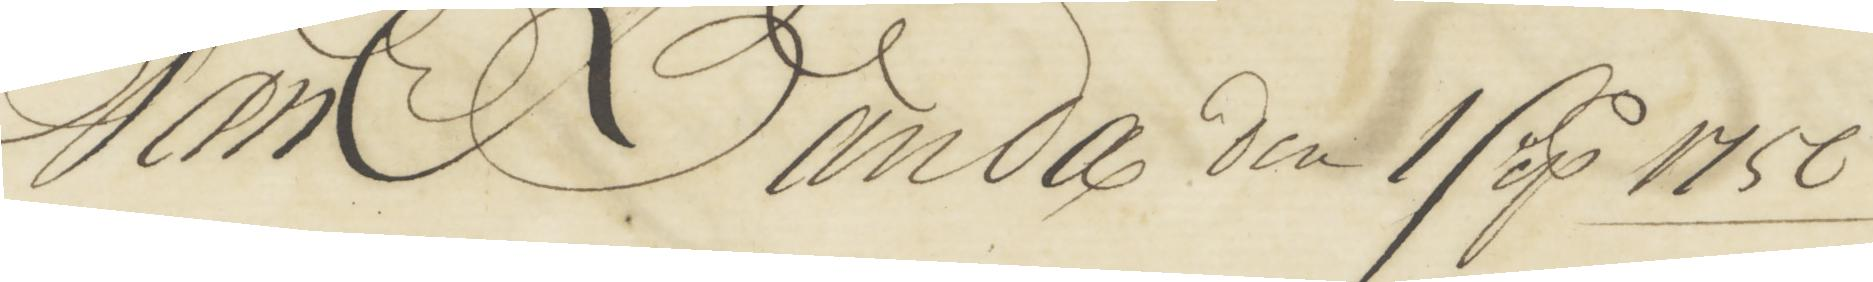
Van Banda den 1 Sep' 1750
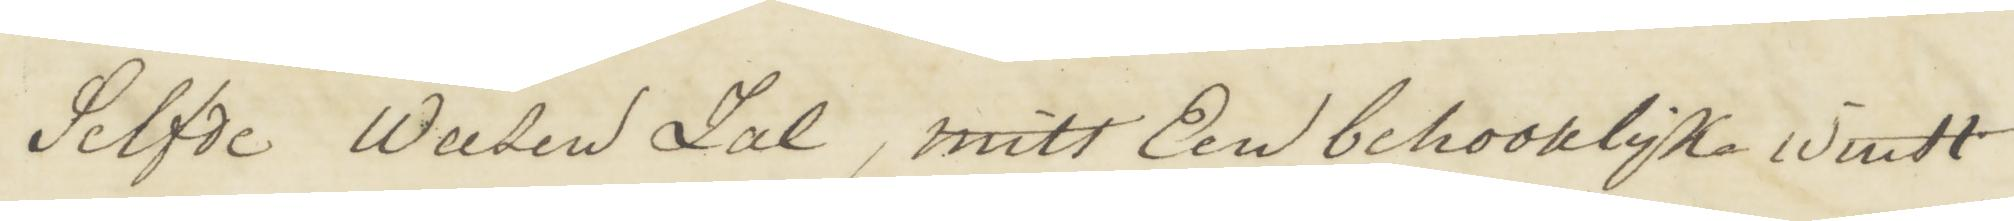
selfde weezen zal, mits Een behoorlijke winst
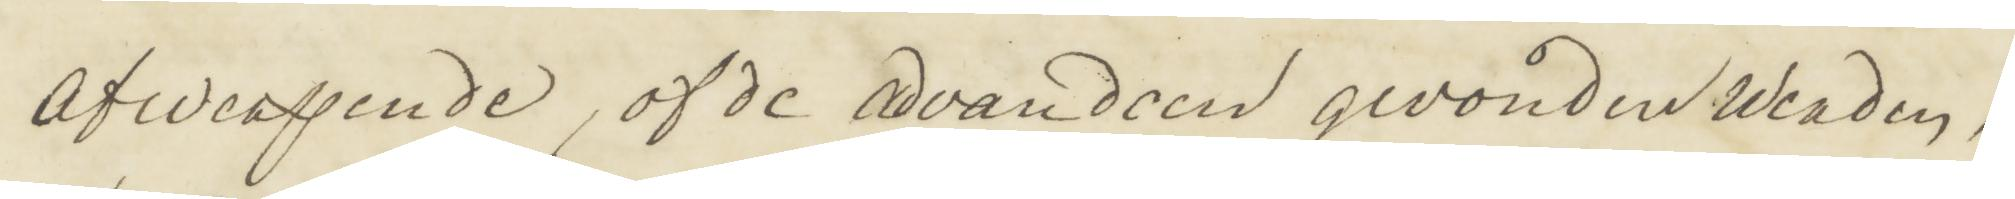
afwerpende, of de advandcen gevonden werden,
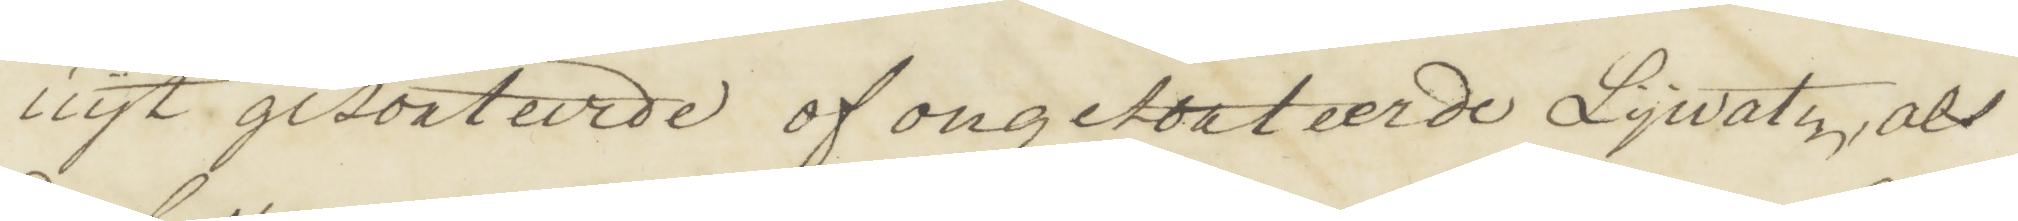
uijt gesorteerde of ongesorteerde Lijwaten, als
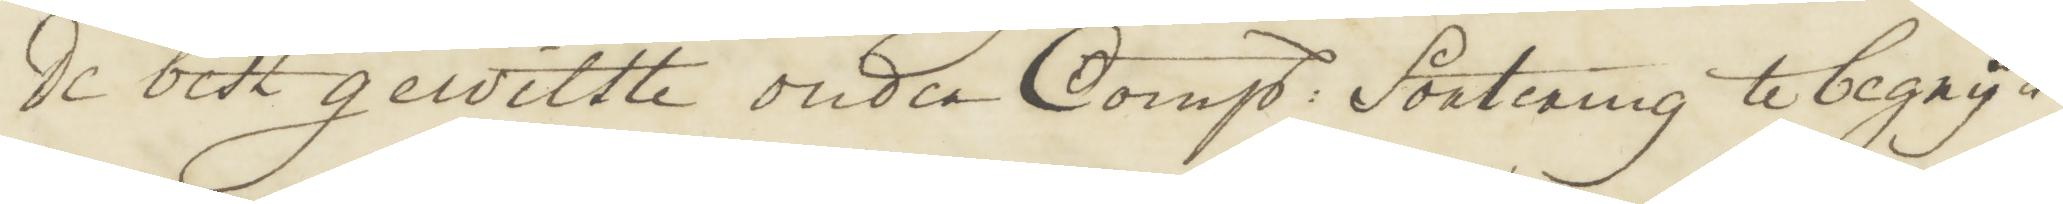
de best gewiltte onder Comp:s sortering te begrij„
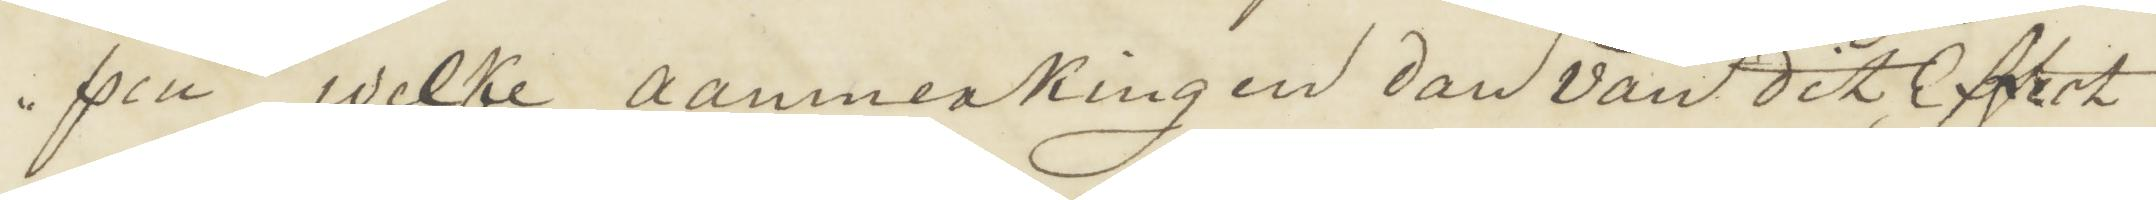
„pen welke aanmerkingen dan van dit Effect
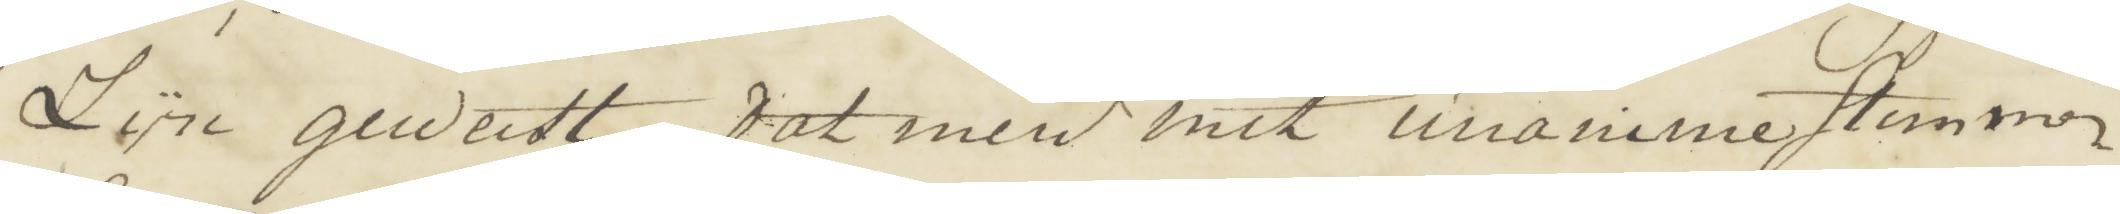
zijn geweest, dat men met unanime stemmen
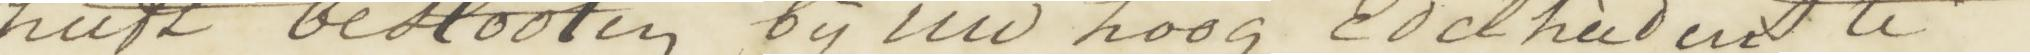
heeft beslooten bij uw hoog Edelhedens te
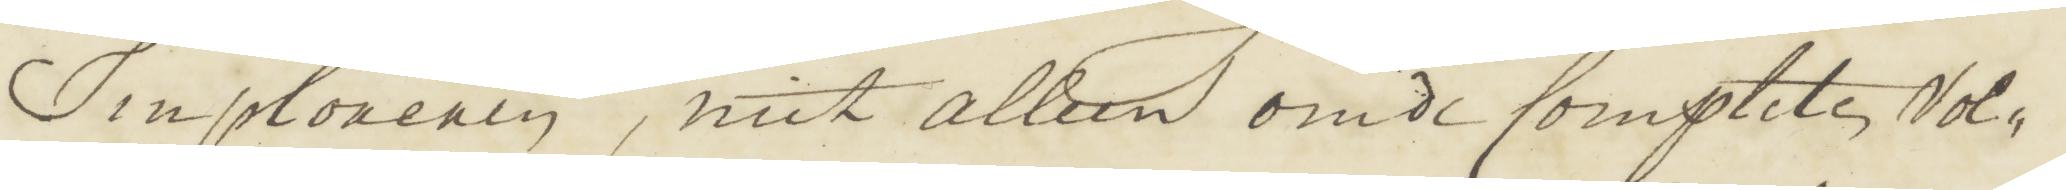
Iinploreren, niet alleen om de Complete vol„
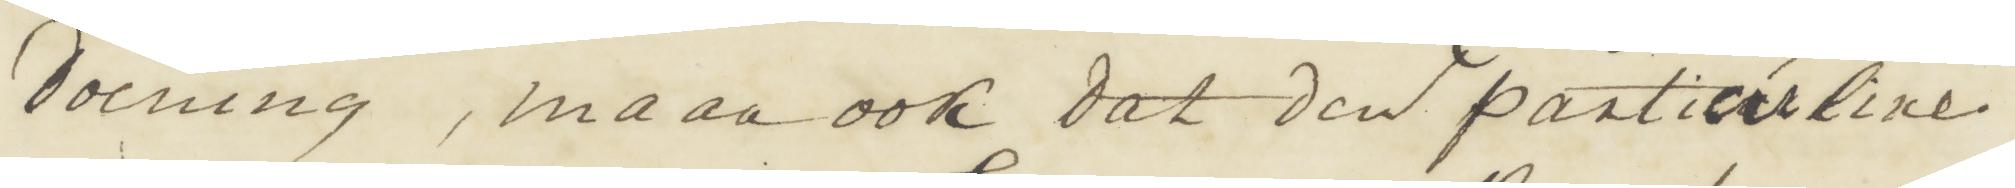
doening, maar ook dat den particulire
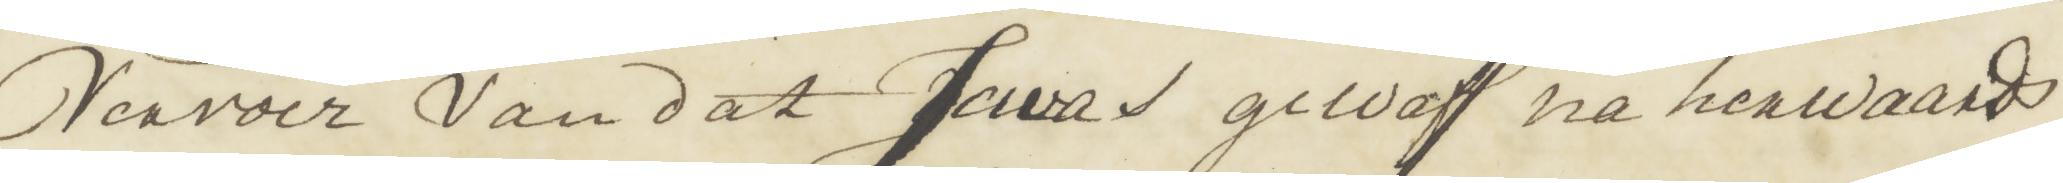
Vervoer van dat Javas gewass na herwaards
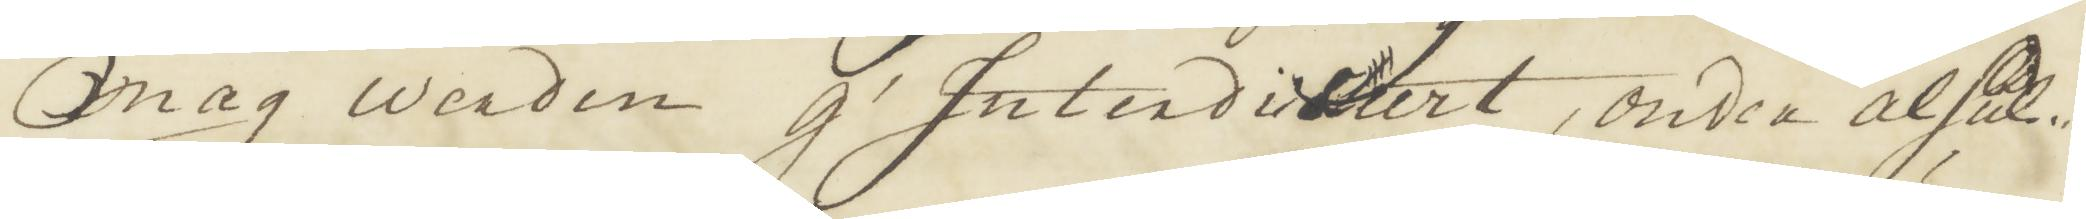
mag werden g’Jnterdiceert, onder alsul„
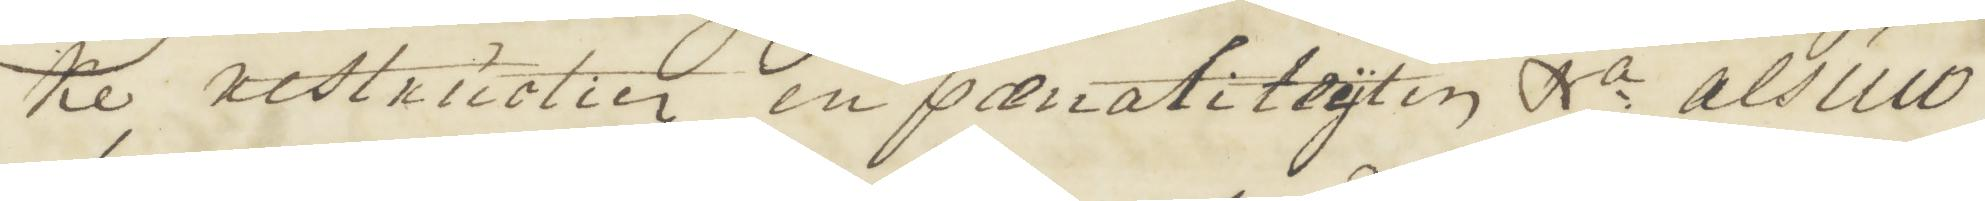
ke restructien en paenaliteijten &:a als uw
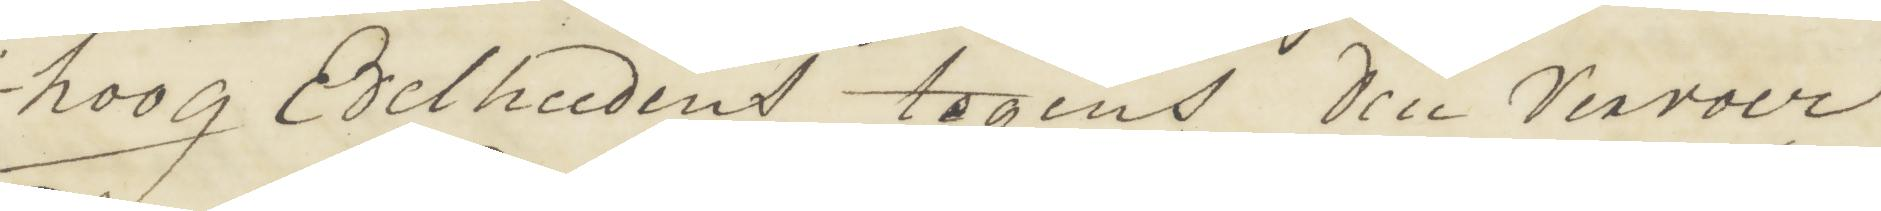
hoog Edelheedens tegens den vervoer
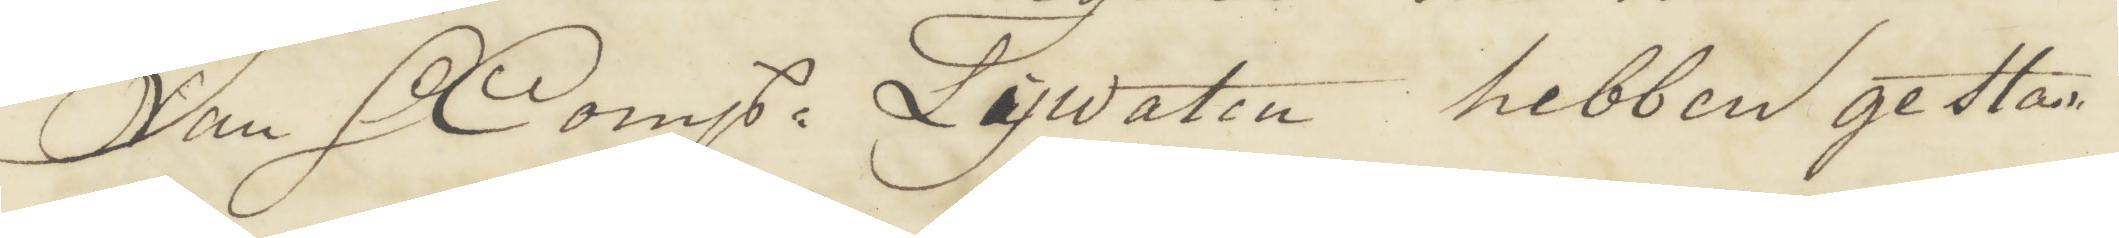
Van SComp:s Lijwaten hebben gesta„
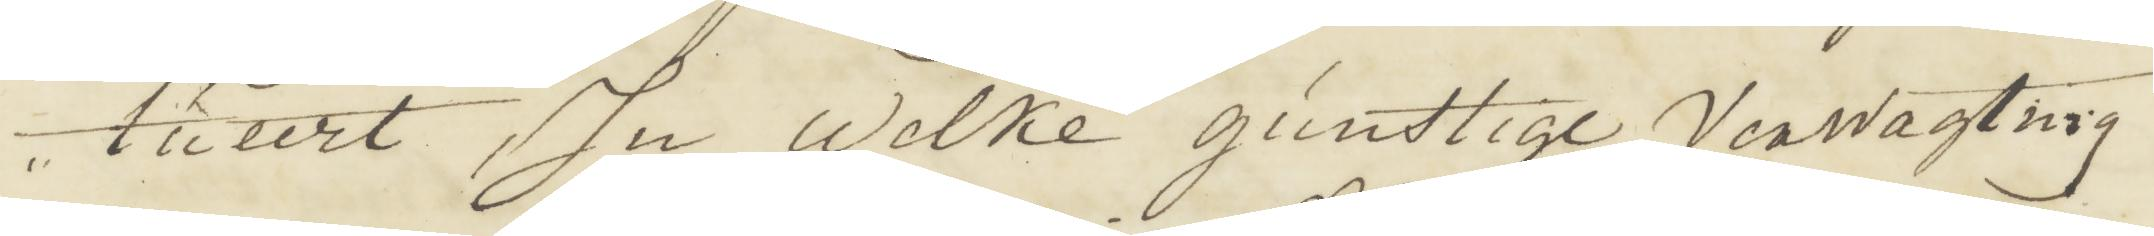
„tueert, Jn welke gunstige verwagting
